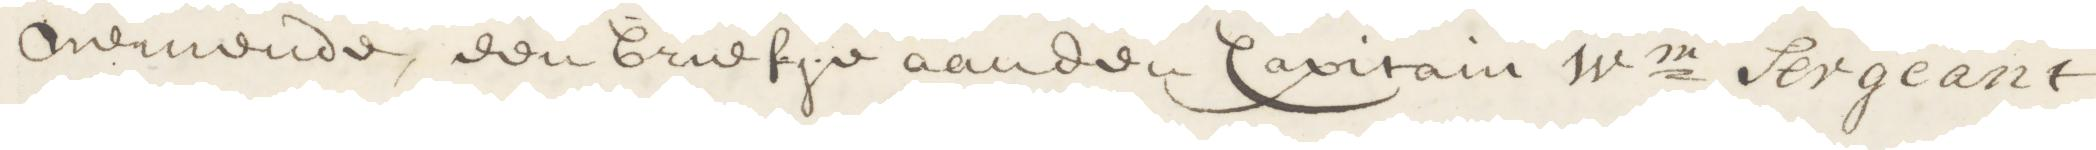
nemende, een briefje aan den Capitain W=m sergeant
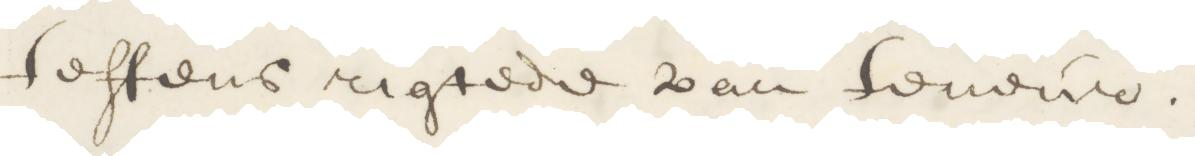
teffens rigtede van teneur.
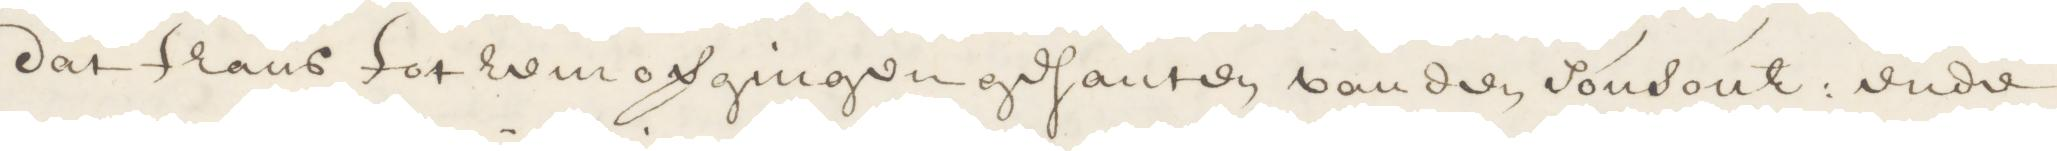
dat thans tot hem overgingen gesanten van den sousouh: ende
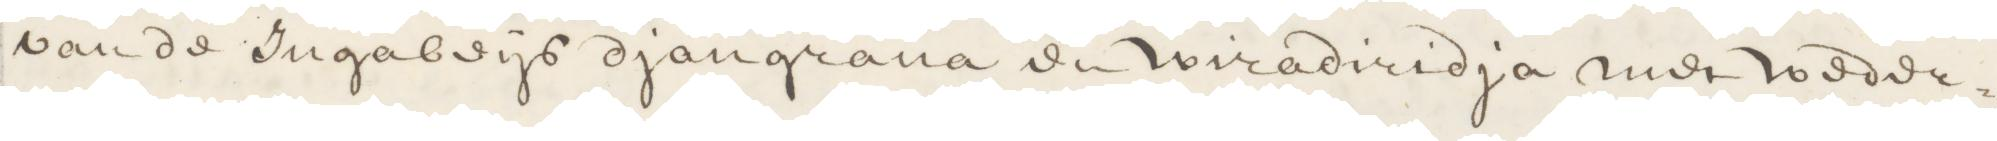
van de Ingabeijs djangrana en wiradiridja met weder„
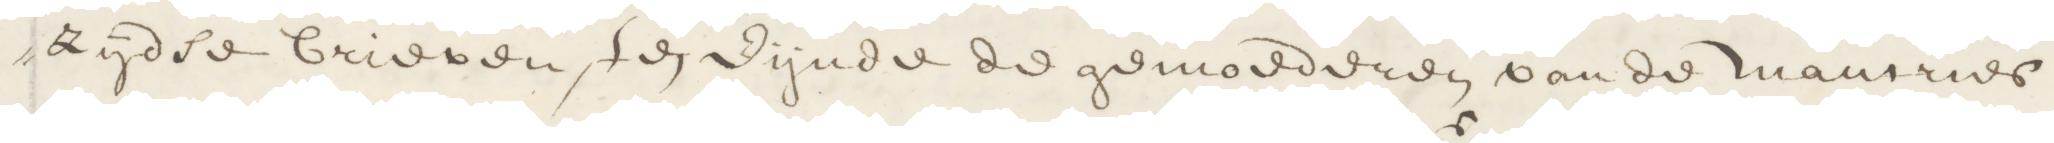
„zijdse brieven, ten Eijnde de gemoederen van de mantries
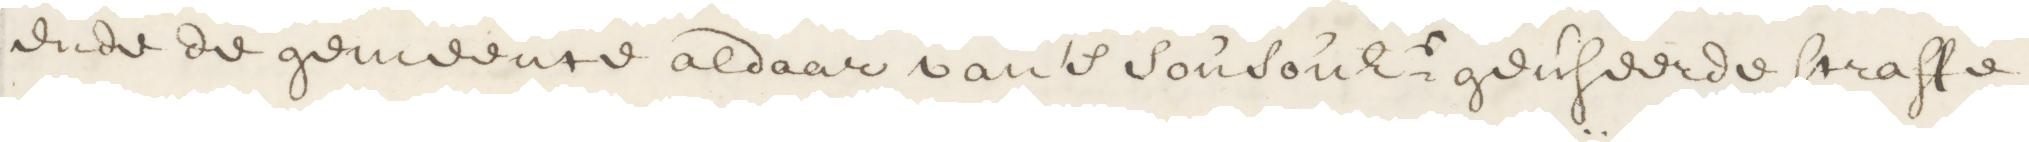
ende de gemeente aldaar van ’s sousouh=s geuseerde straffe
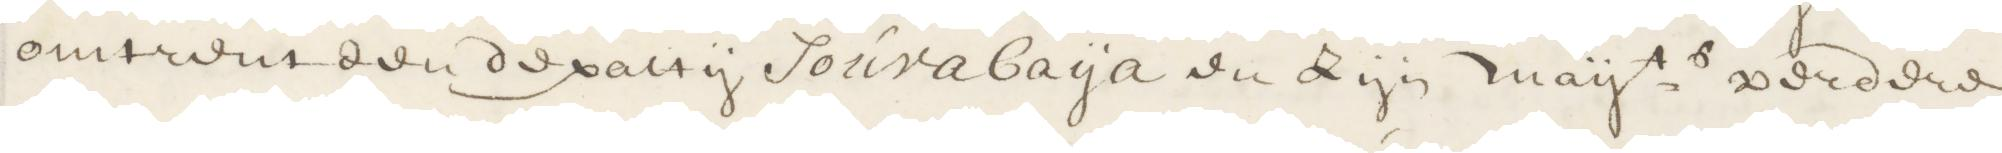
omtrent den depattij sourabaija en zijn maij=ts verdere
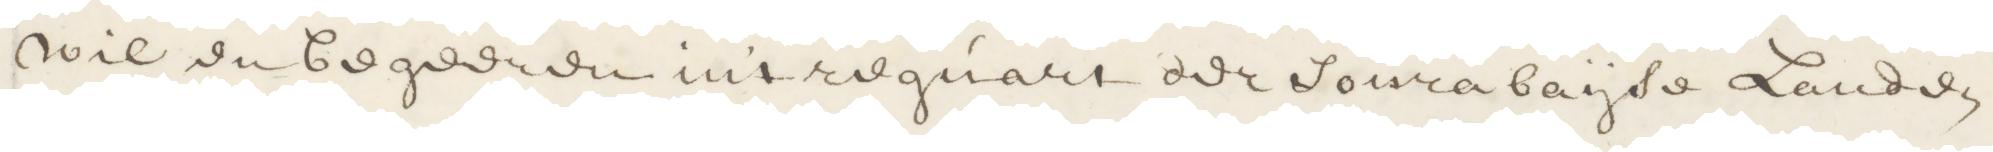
wil en begeeren in’t reguart der sourabaijse landen
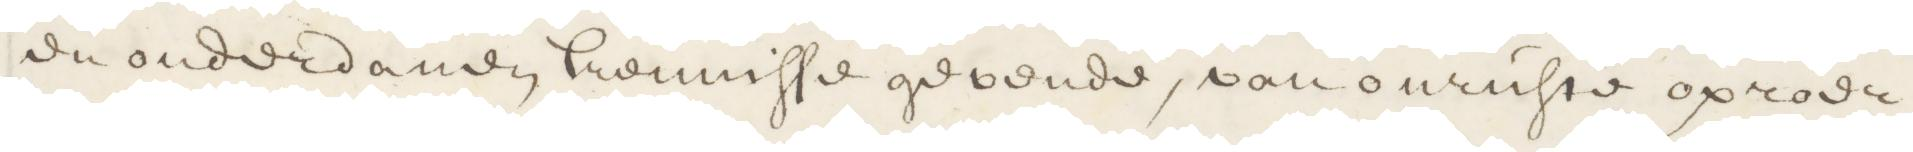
en onderdanen kennisse gevende, van onruste oproer
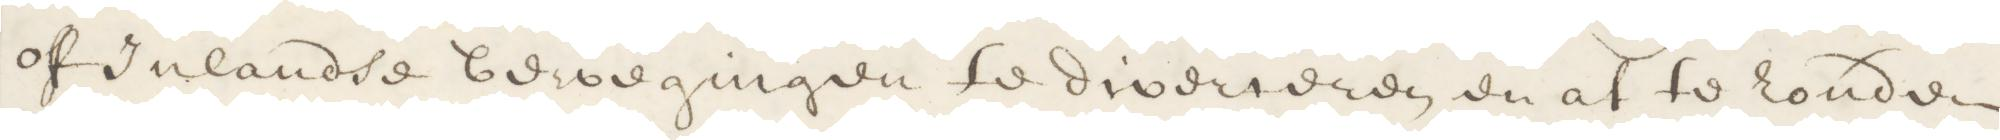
of Inlandse bewegingen te diverteren en af te houden
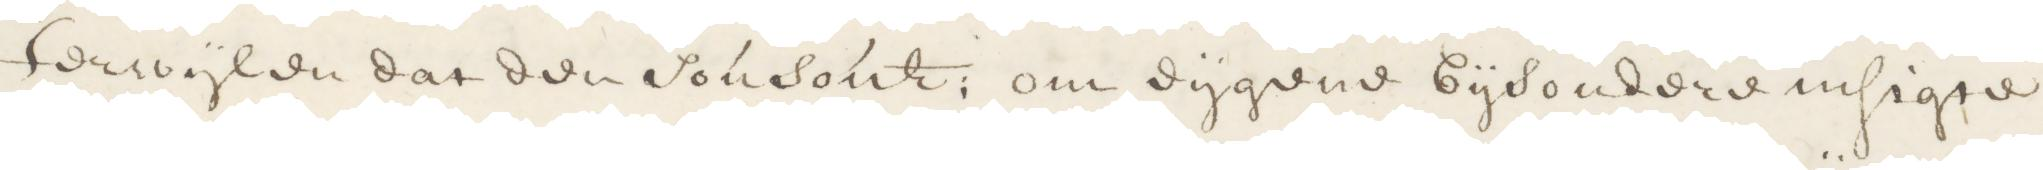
terwijlen dat den sousouh: om eijgene bijsondere insigte
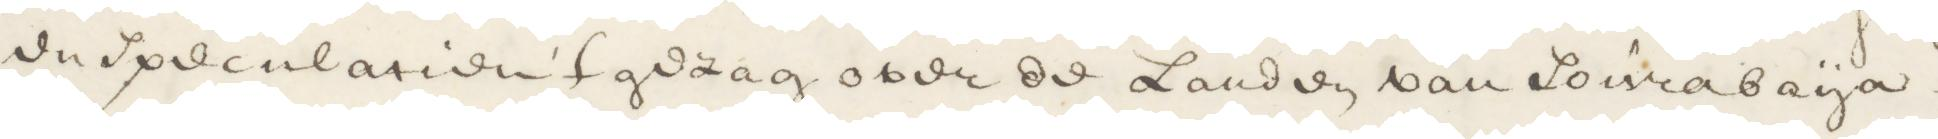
en speculatien ’t gezag over de landen van sourabaija
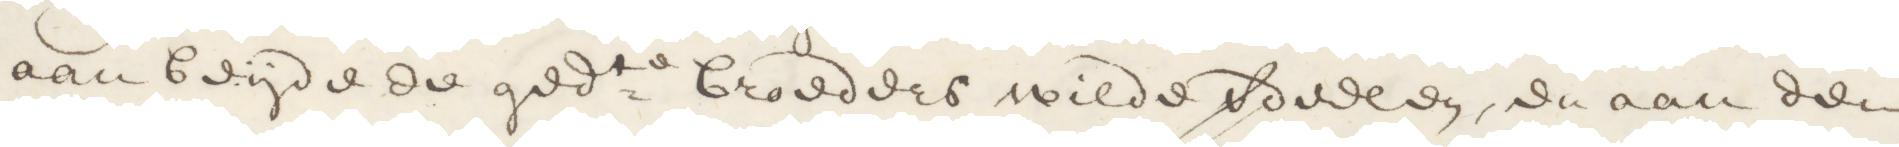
aan beijde de ged=te broeders wilde verdeelen, en aan den
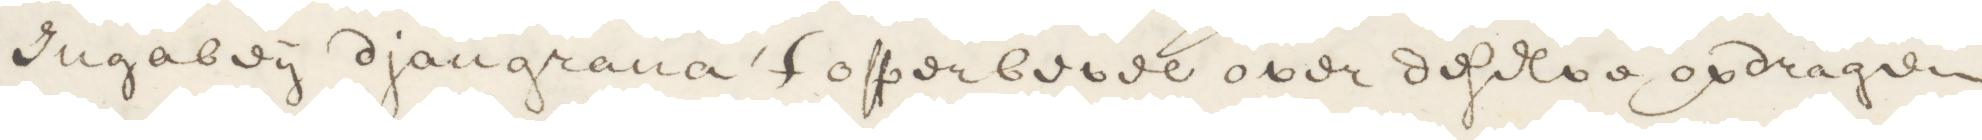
Ingabeij djangrana 't opperbevel over deselve opdragen
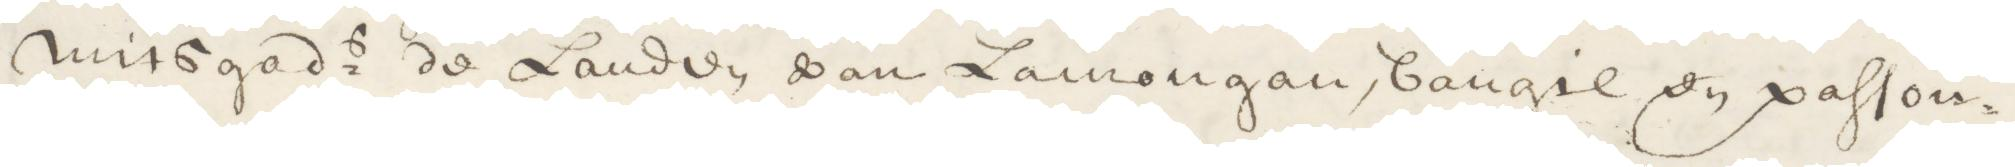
mitsgad=s de landen van lamongan, bangil en passou=
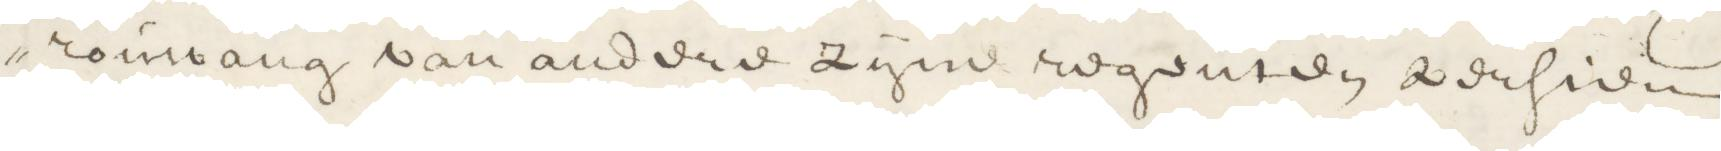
„ rouwang van andere zijne regenten versien
